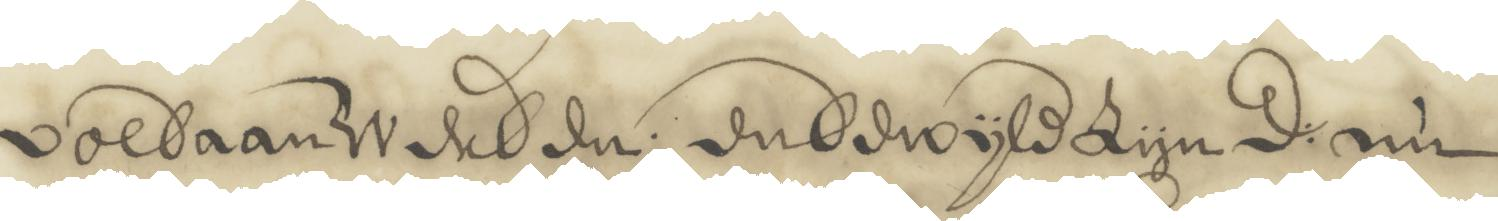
voldaan werden; endewijle zijn E: nu
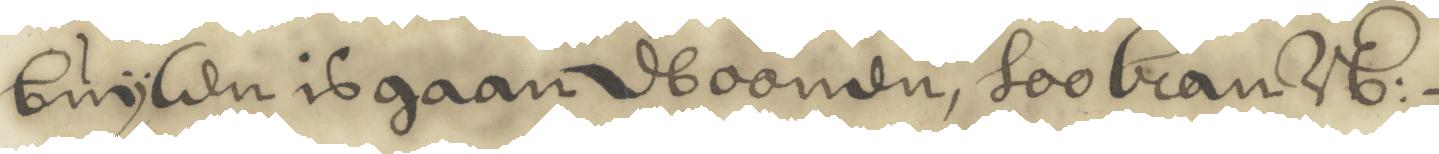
buijten is gaan woonen, soo kan VE: —
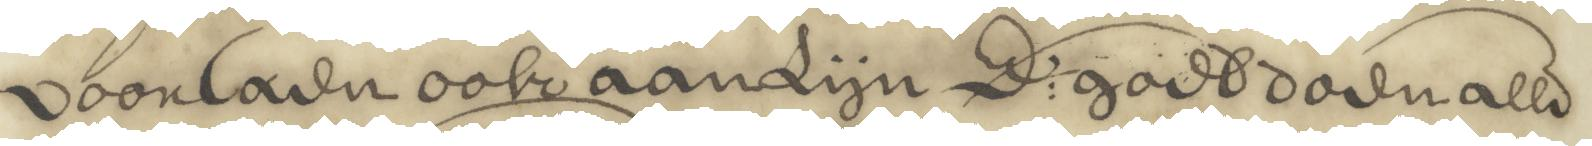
voortaen ook aan zijn E: goed doen alle
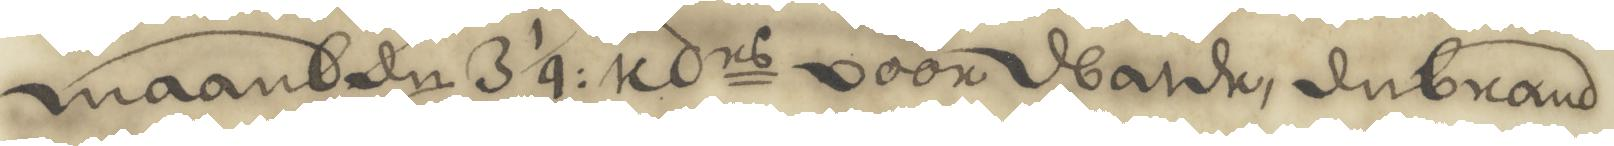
maanden 3¼: rd=rs voor water, en brand
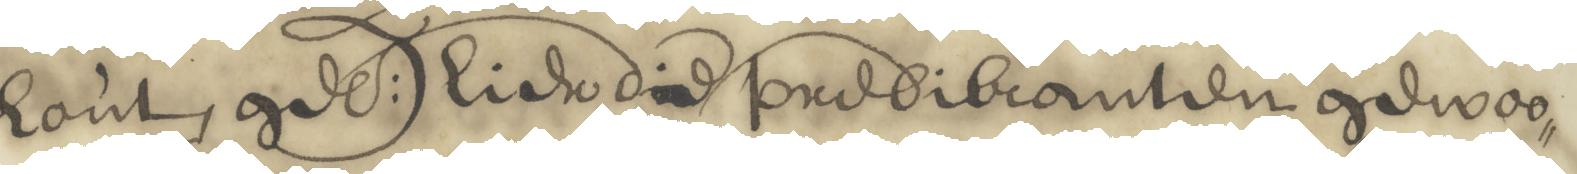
hout, gelijk hier die predikanten gewoo„
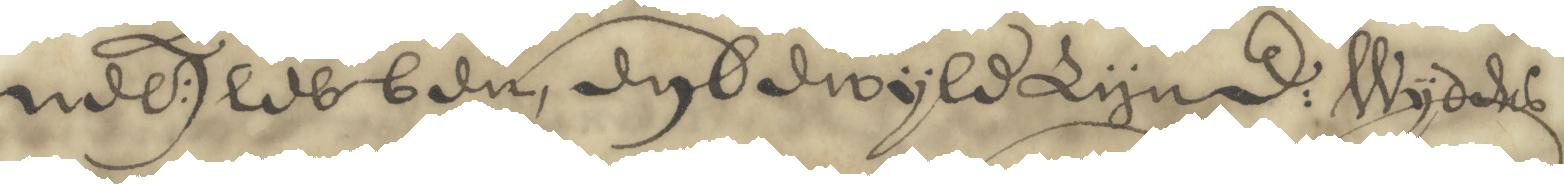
nelijk hebben, endewijle zijn E: Wijders
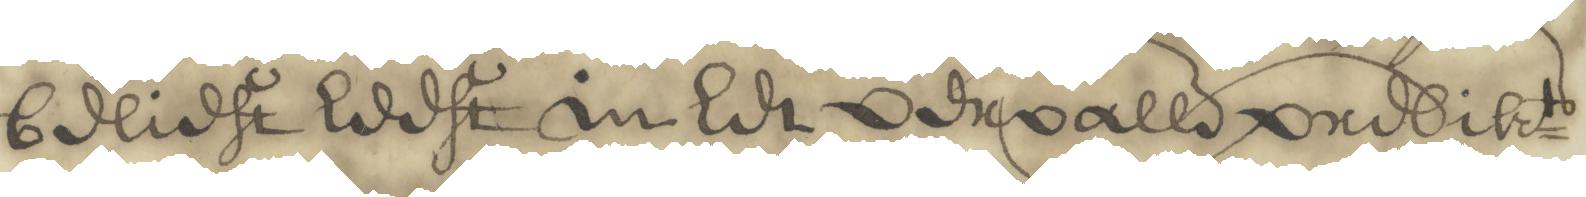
belieft heeft in het vervalle predik=ts
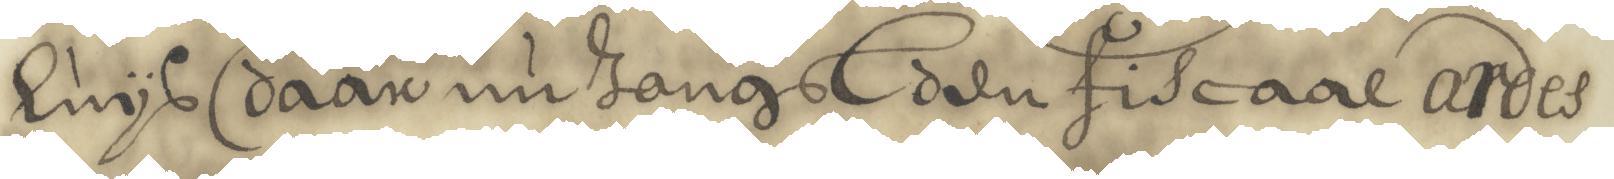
huijs (daar nu iongst den fiscaal ardes
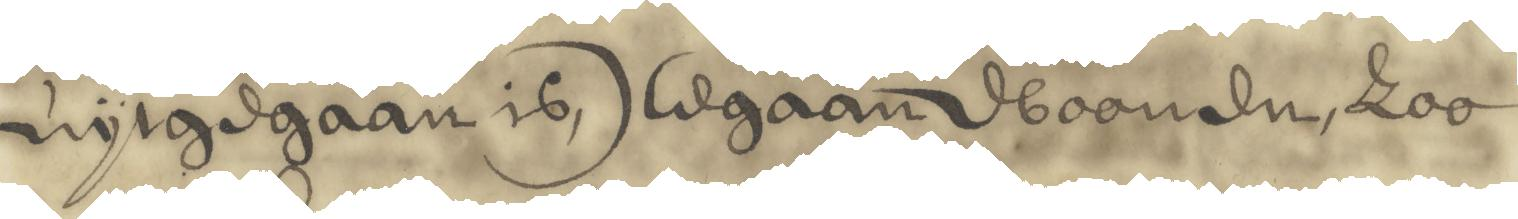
uijtgegaan is,) tegaan woonen, zoo
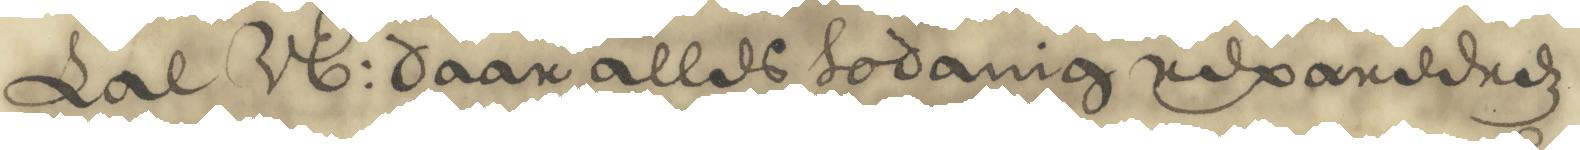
zal VE: daar alles sodanig repareeren
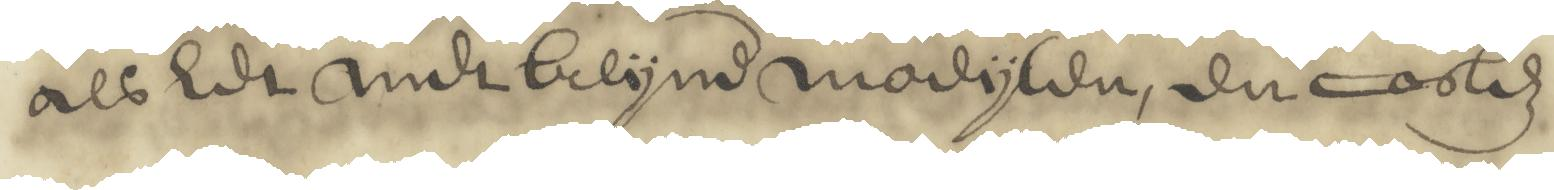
als het met klijne moeijten, en costen
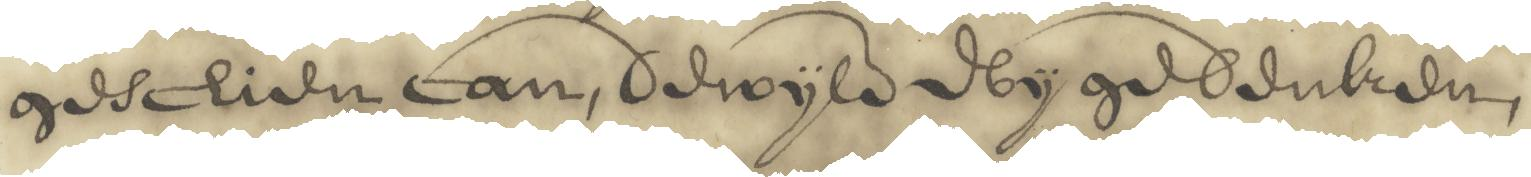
geschien can, dewijld wij gedenken,
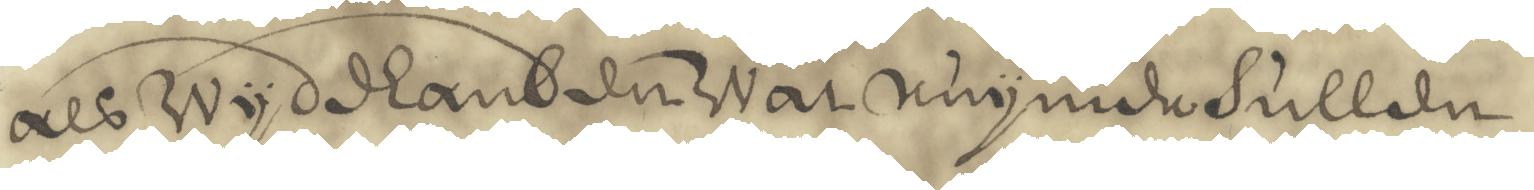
als wij dehanden wat ruijmer sullen
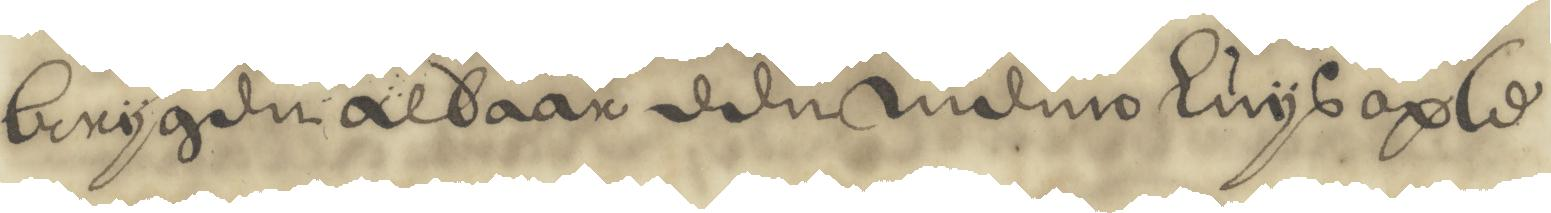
krijgen aldaar een nieuw huijs op te
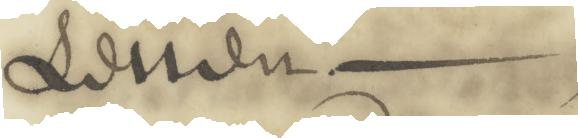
setten. —
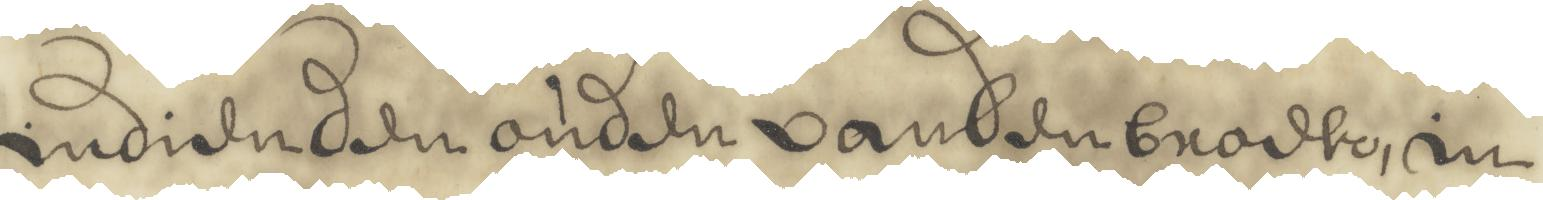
indien den ouden vanden broek, in
